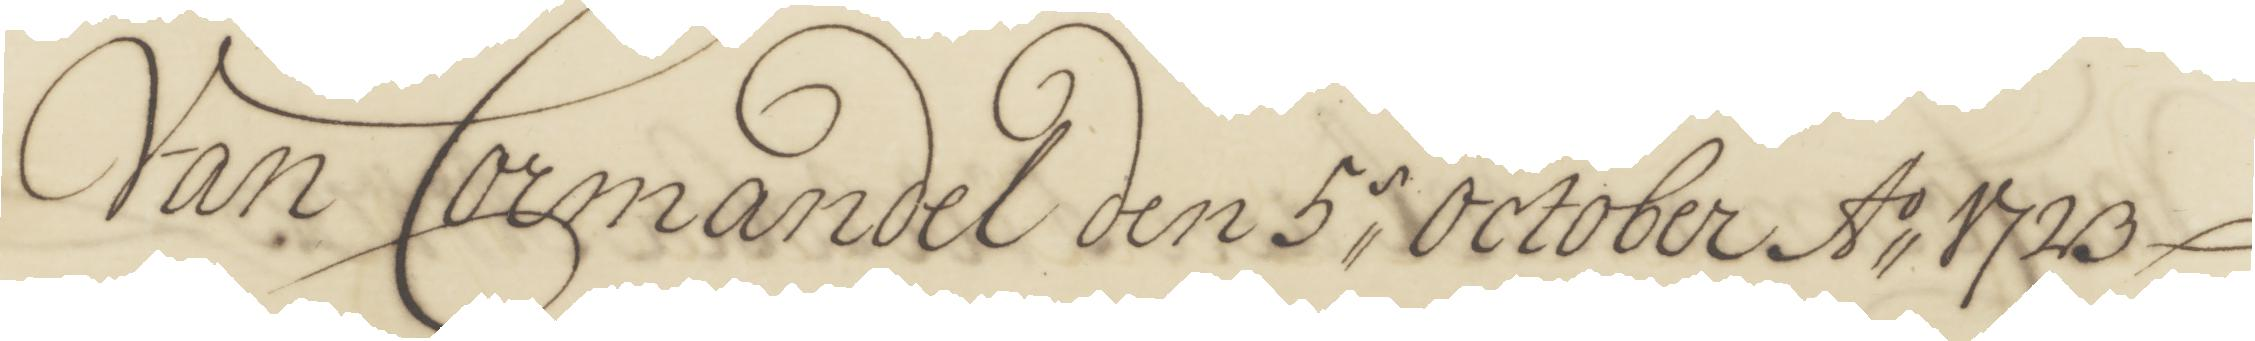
Van Cormandel den 5„e october A„o 1723 —
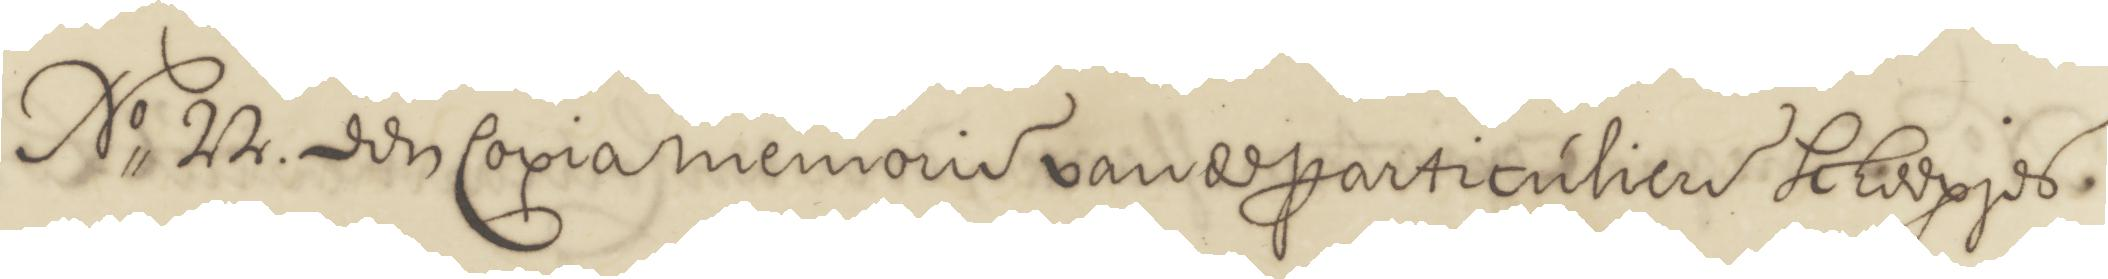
N„o 22. een Copia memorie van de particuliere scheepjes
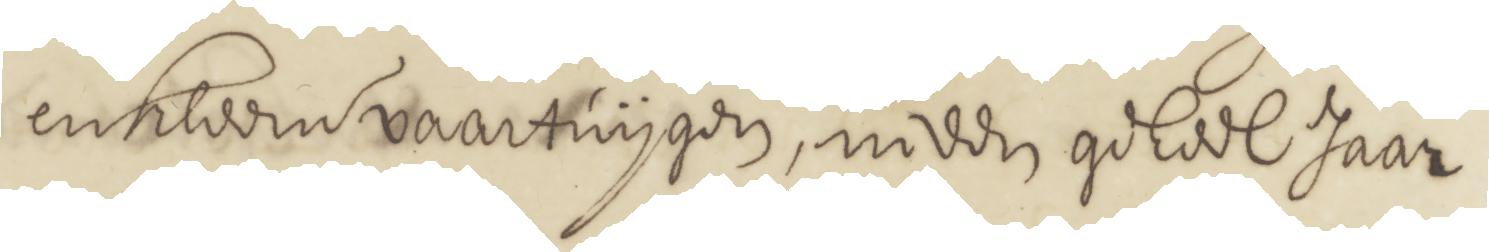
en kleene vaartuijgen, in een geheel Jaar
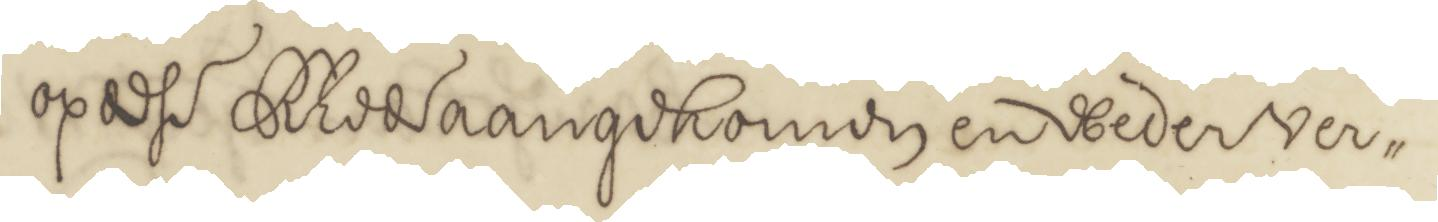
op dese Rhede aangekomen en weder ver„
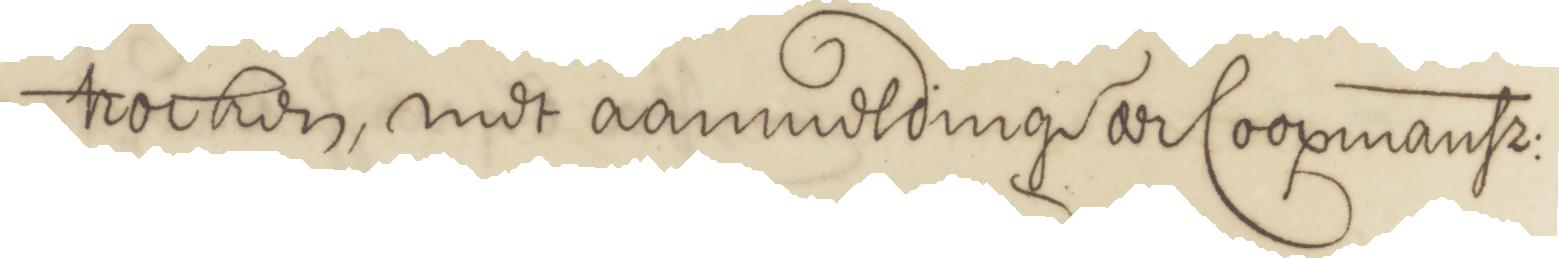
trocken, met aanmeldinge der Coopmansz:
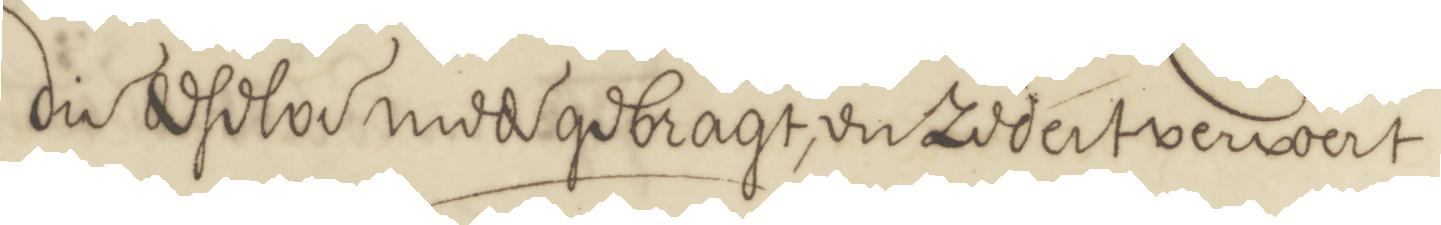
die deselve mede gebragt, en zedert vervoert
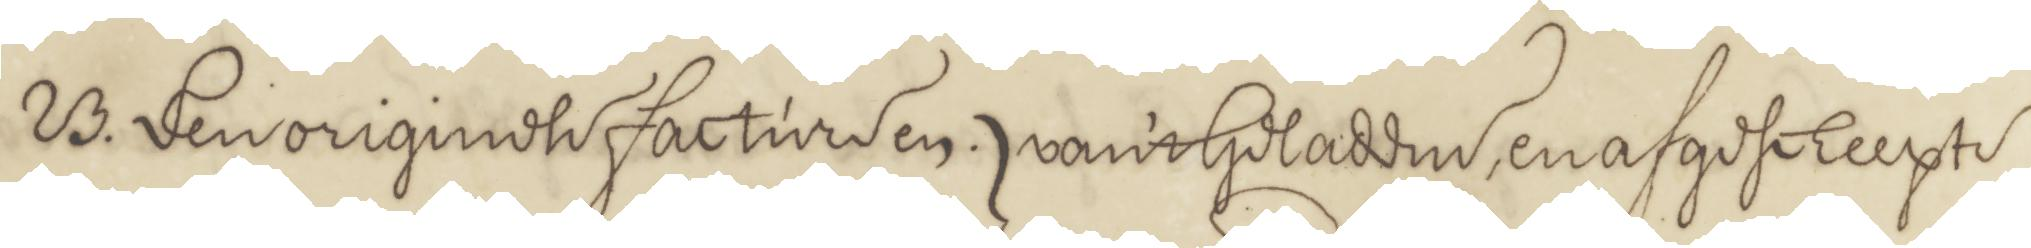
23. Een originele facture en. } van 't Geladene, en afgescheepte
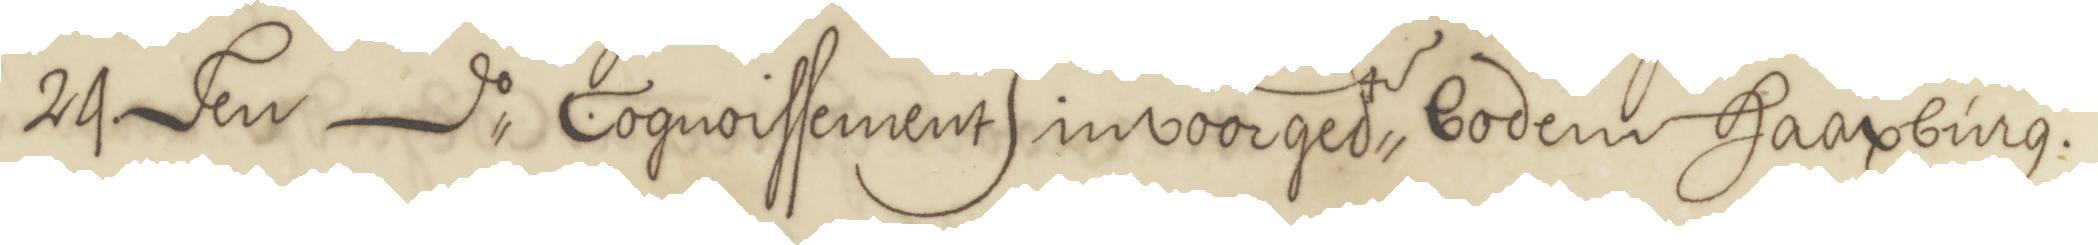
2.4 Een D„o Cognoissement in voor ged„te bodem Haaxburg.
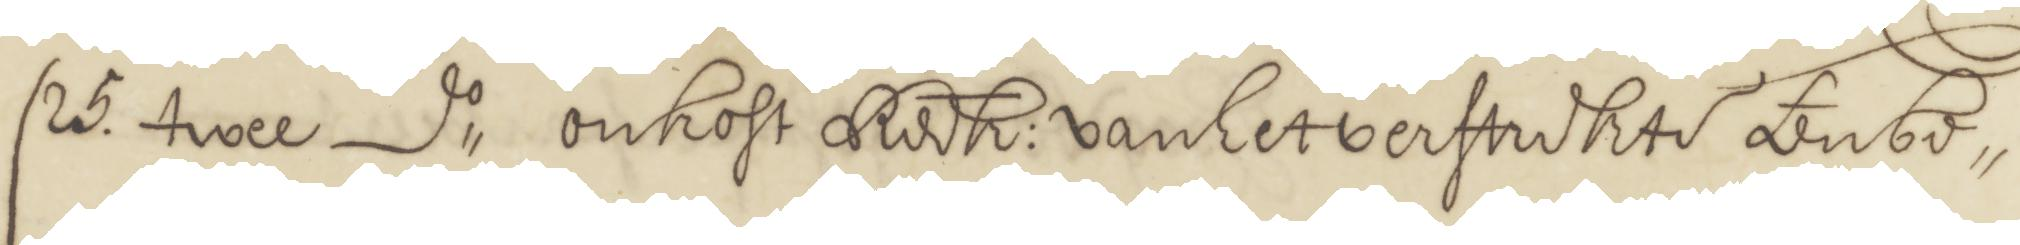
{ 25. twee D„o onkost Reek: van het verstrekte tenbe„
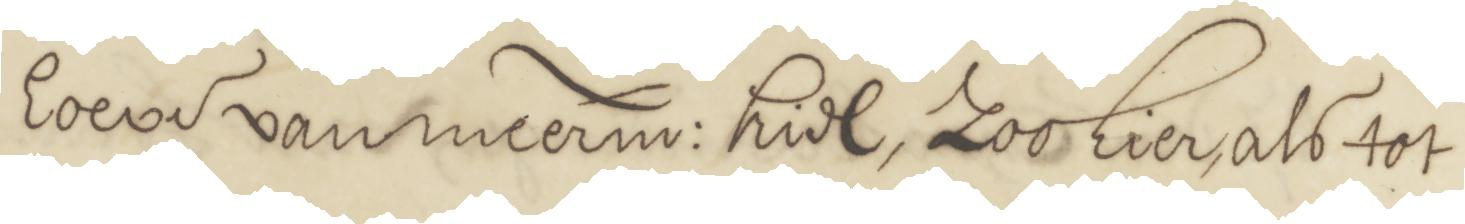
hoeve van meerm: kiel, zoo hier, als tot
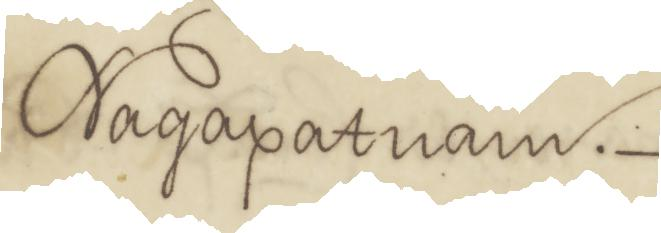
Nagapatnam. —
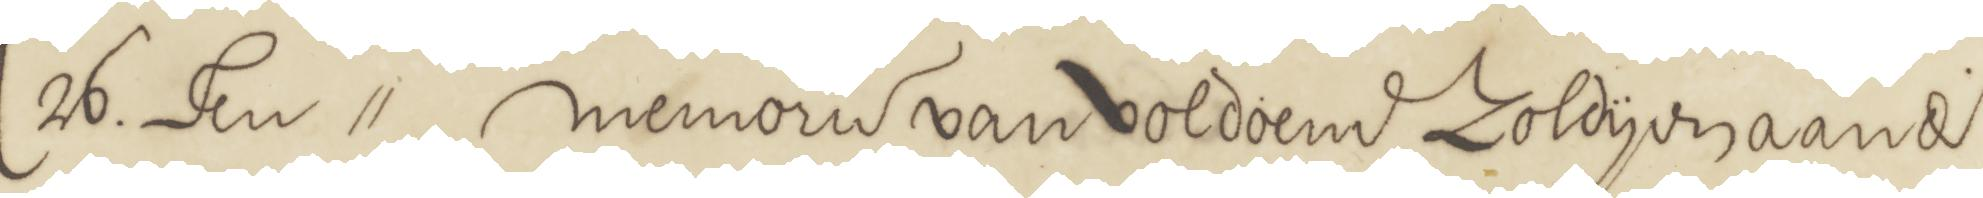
26. Een „ Memorie van Voldoene zoldijen aan de
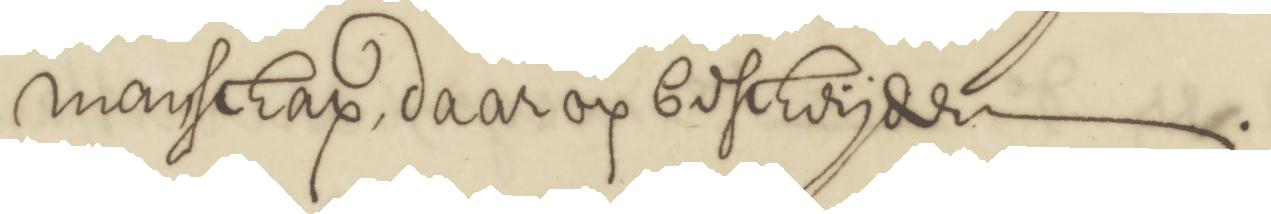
manschap, daar op bescheijden.
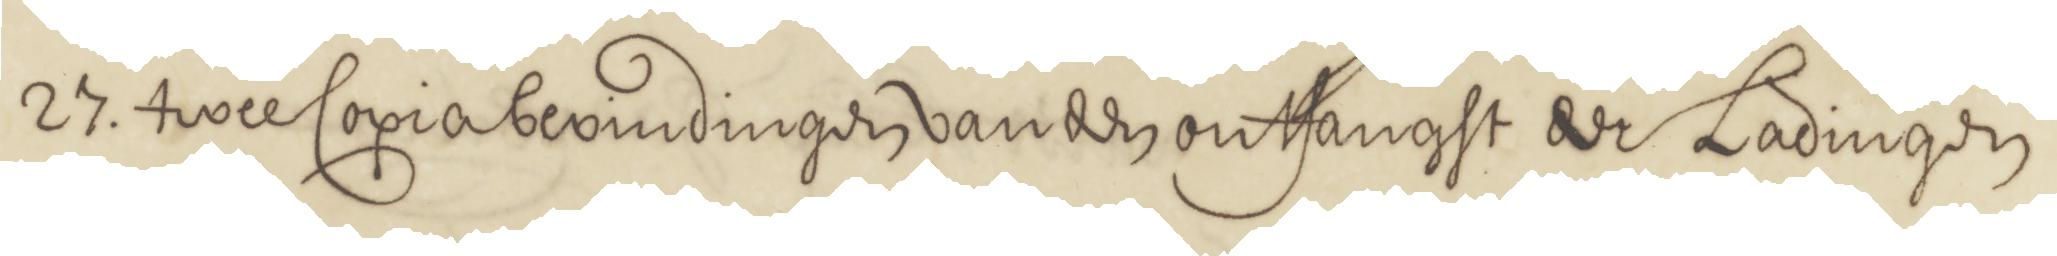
27. twee Copia bevindingen Van den ontfangst der Ladingen
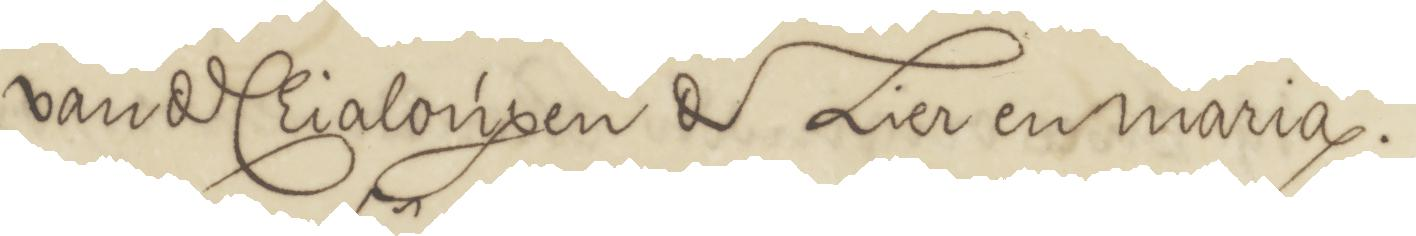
van de Chialoupen de Zier en maria.
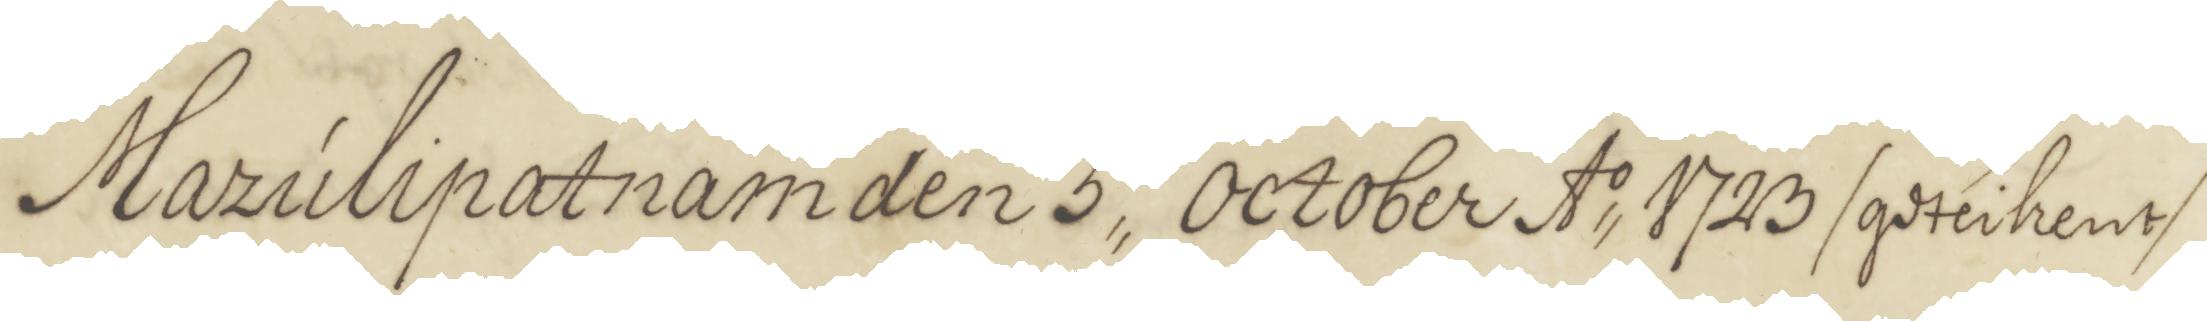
Mazulipatnam den 5„e october A„o 1723 /geteikent/
